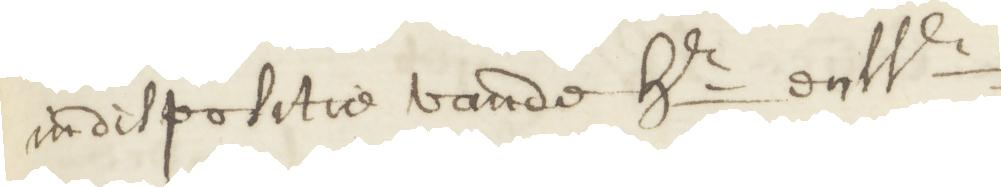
indispositie vande H=r eyss=r
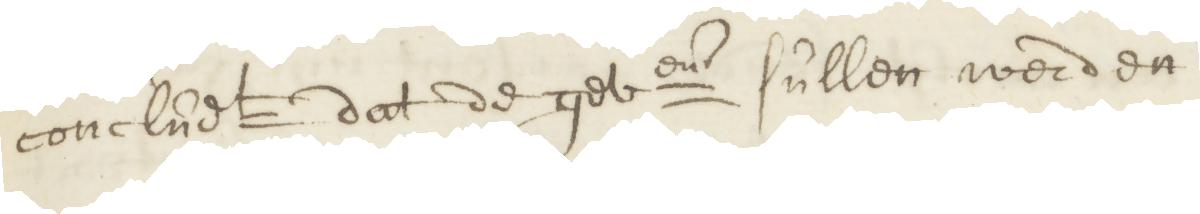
conclud=t dat de gev=ens sullen werden
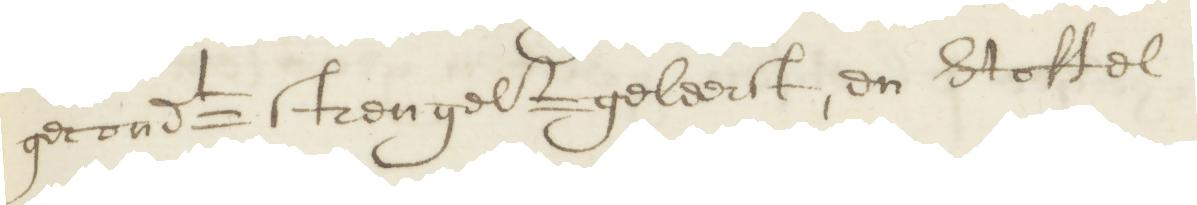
gecond=t strengelijk geleerst, en Stoffel
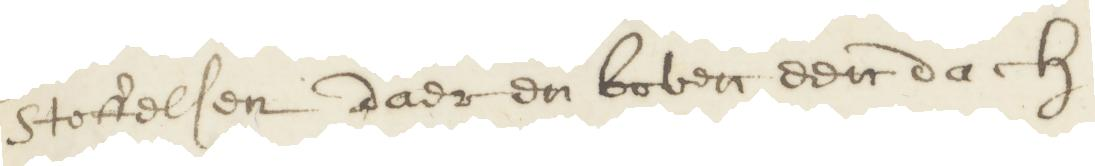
stoffelsen daer en boven een dach
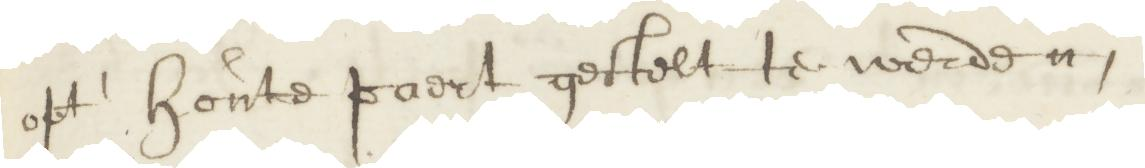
opt' houte paert gestelt te werden,
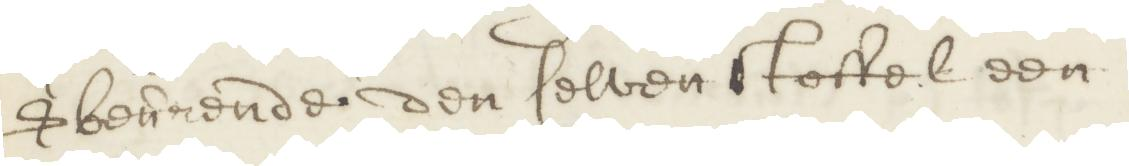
ende verbeurende den selven stoffel een
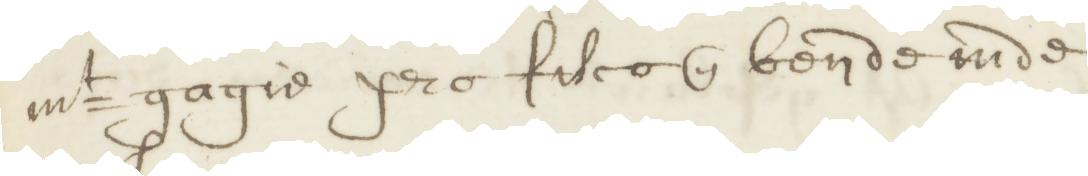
m=t gagie pro fisco ende beyde inde
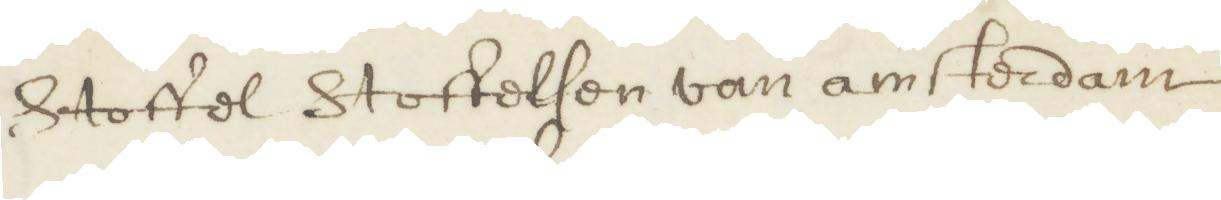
Stoffel Stoffelsen van amsterdam
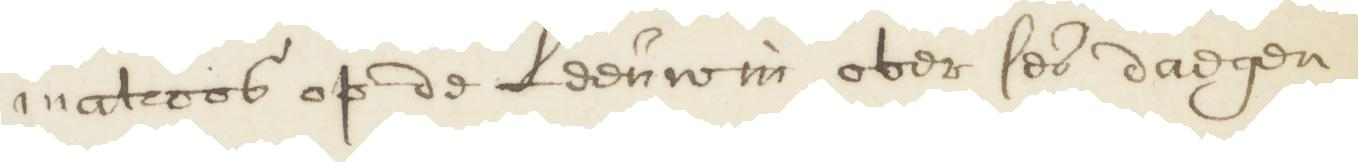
matroos op de Leeuwin over ses daegen
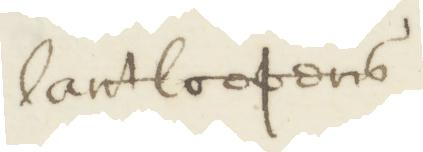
lantloopens
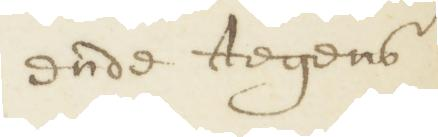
ende tegens
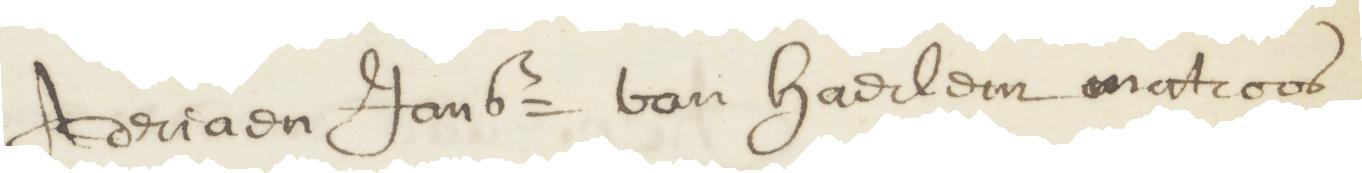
Andriaen Jans=e van Haerlem matroos
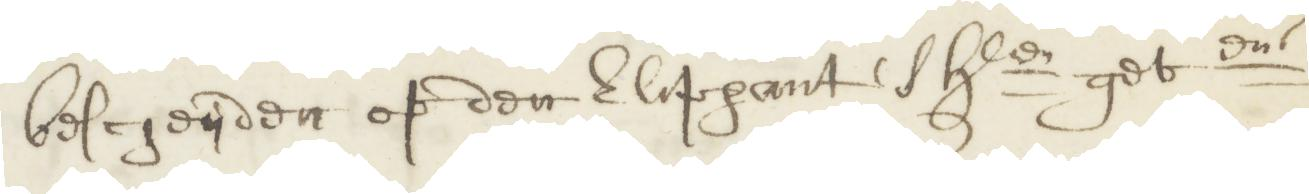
bescheijden op den Eliphant 'S H=ren gev=ens
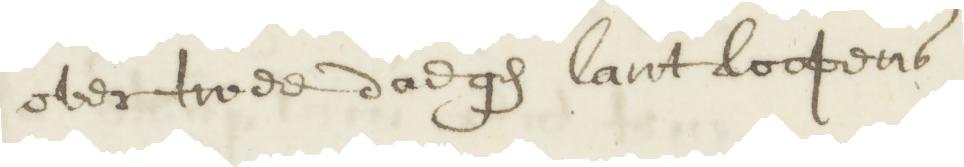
over twee daegen lantloopens
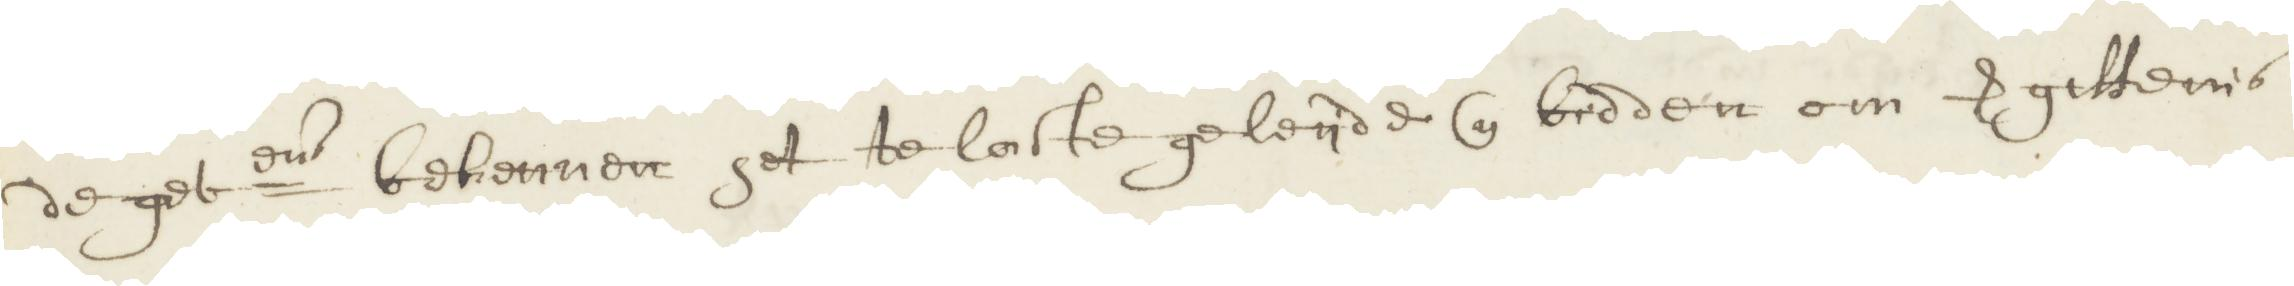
de gev=ens bekennen het te laste geleijde ende bidden om vergiffenis
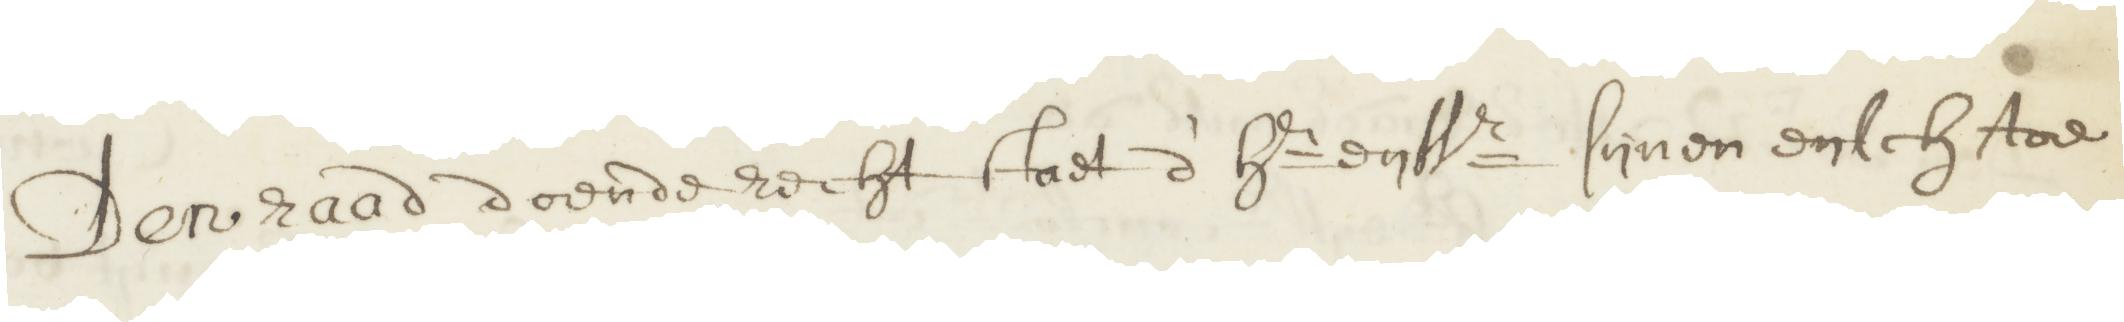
Den raad doende recht staet d’ h=r eyss=r sijnen eysch toe
